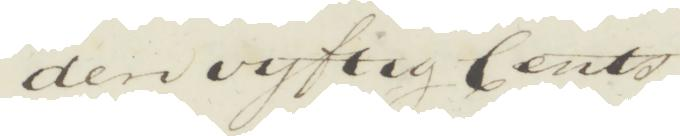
den vyftig Cents
